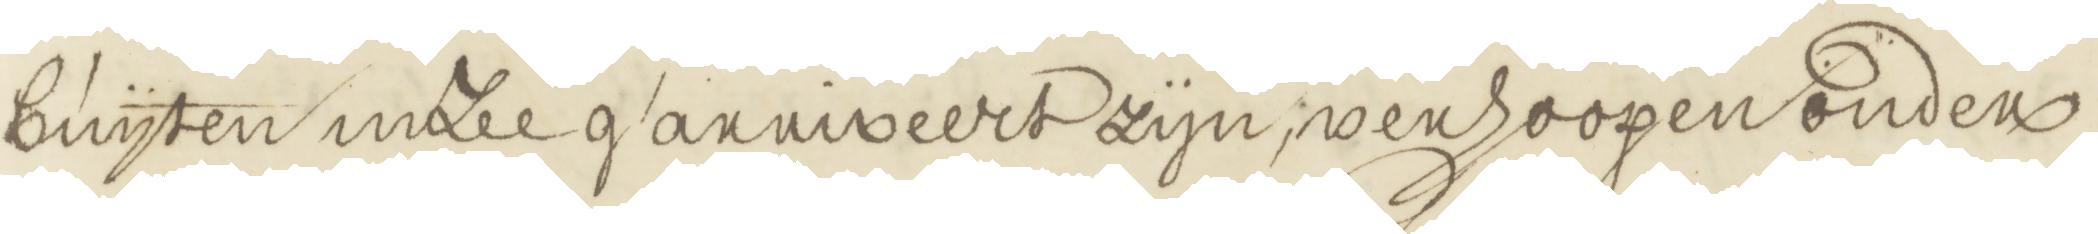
buijten inzee g’arriveert zijn; verhoopen onder
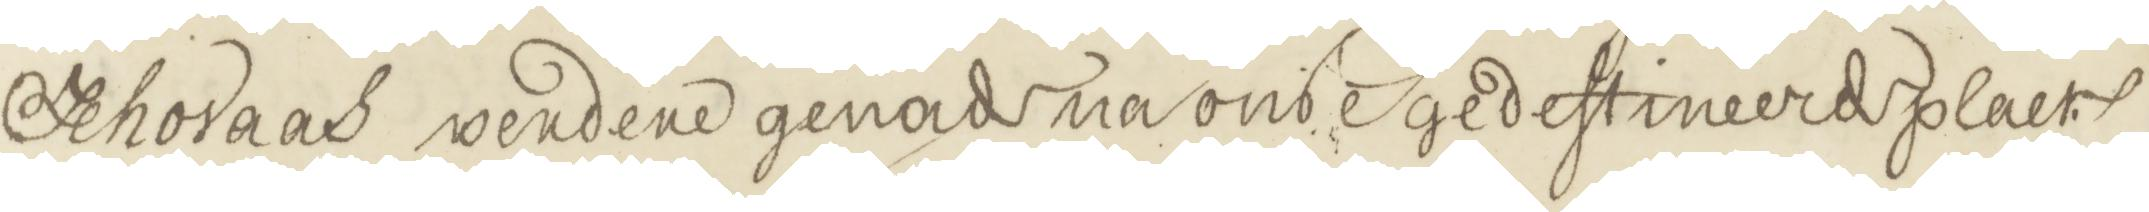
Schovaas verdere genade na onse gedestineerde plaets
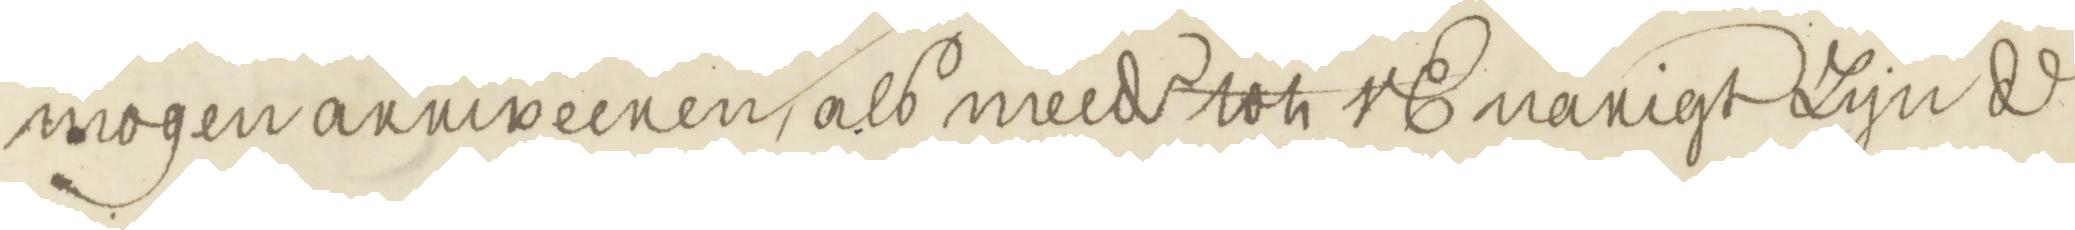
mogen arriveeren, als meede tot vE narigt zijn de
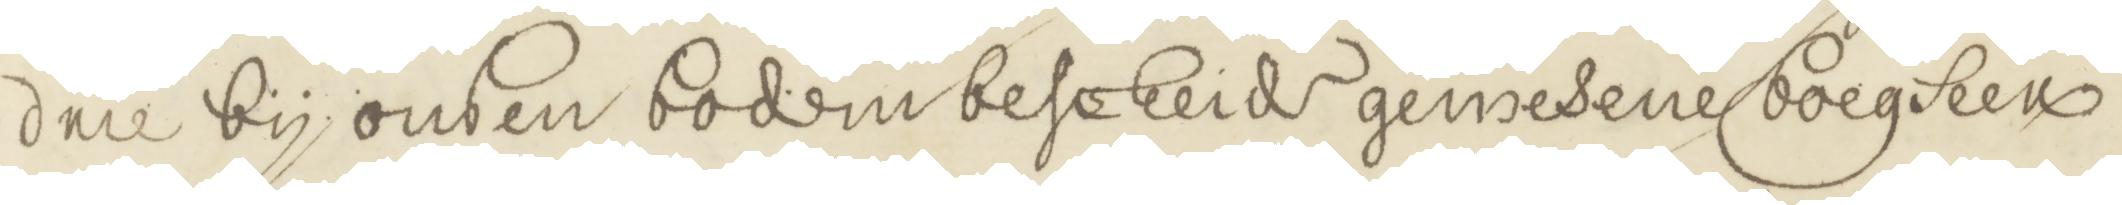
drie bij onsen bodem bescheide gewesene boegseer
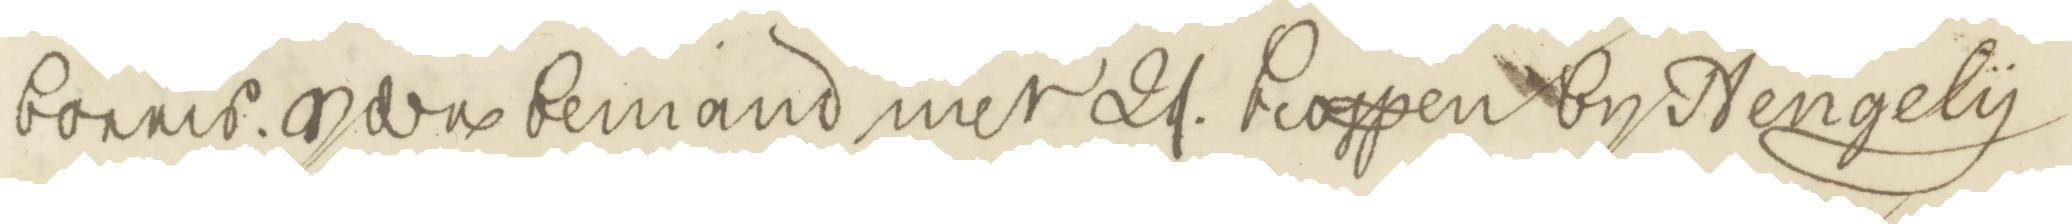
borris. ijder bemand met 24. koppen by Hengelij
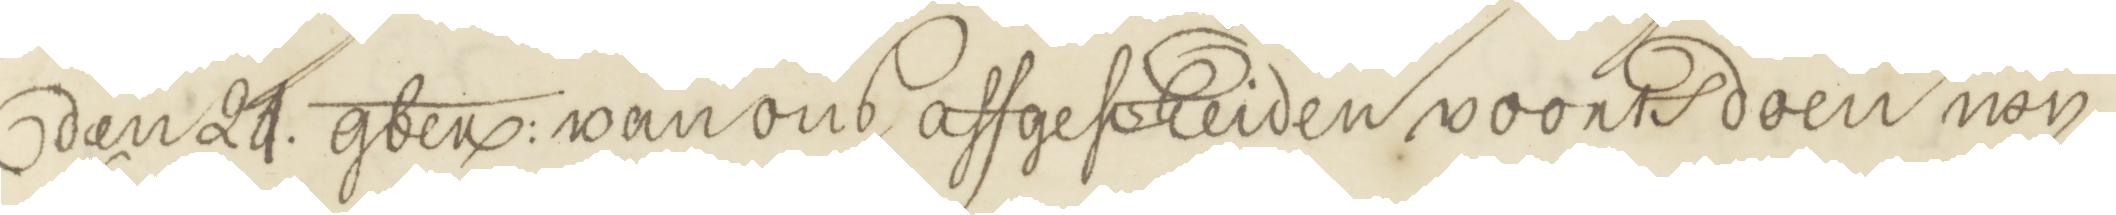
den 24. 9ber: van ons, affgescheiden voorts doen wij
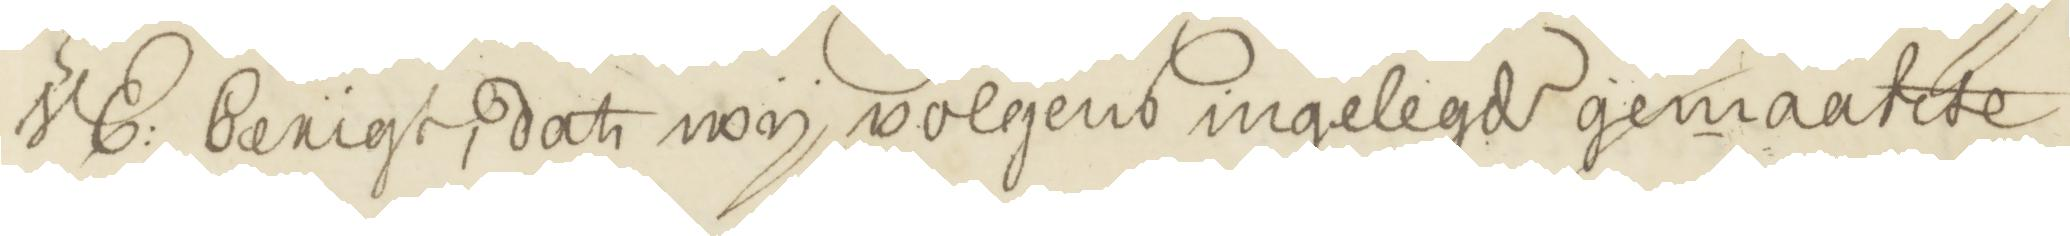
VE: berigt, dat wij volgens ingelegde gemaakte
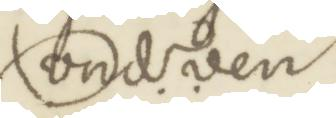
ende een
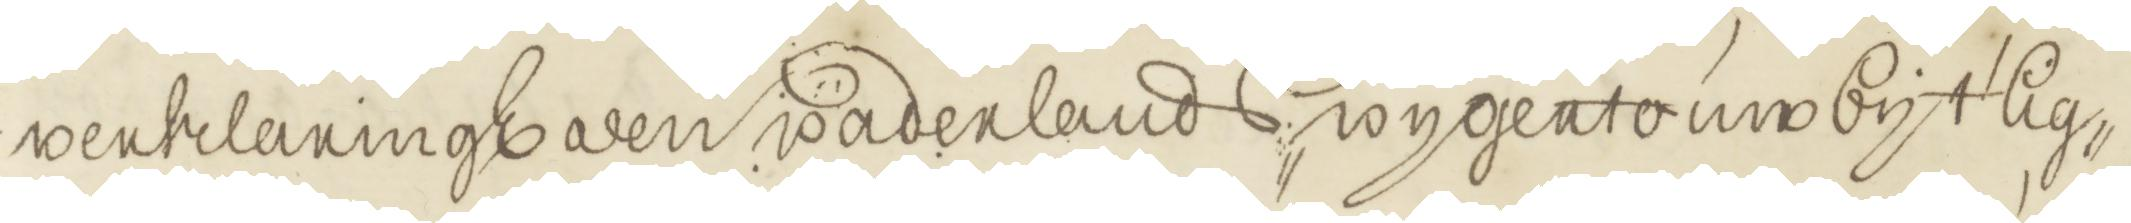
verklaringh een vaderlands: wijgertouw bij t' lig„
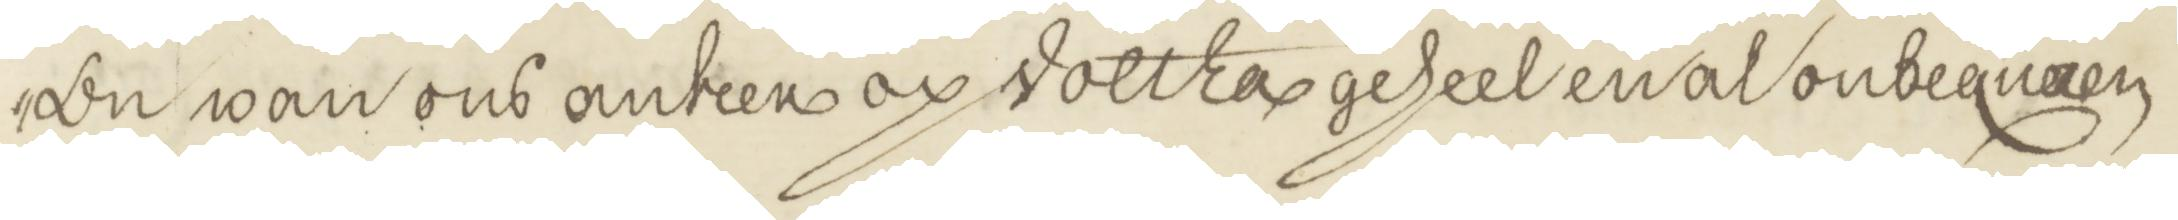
„ten van ons anker op voltha geheel en al onbequaen
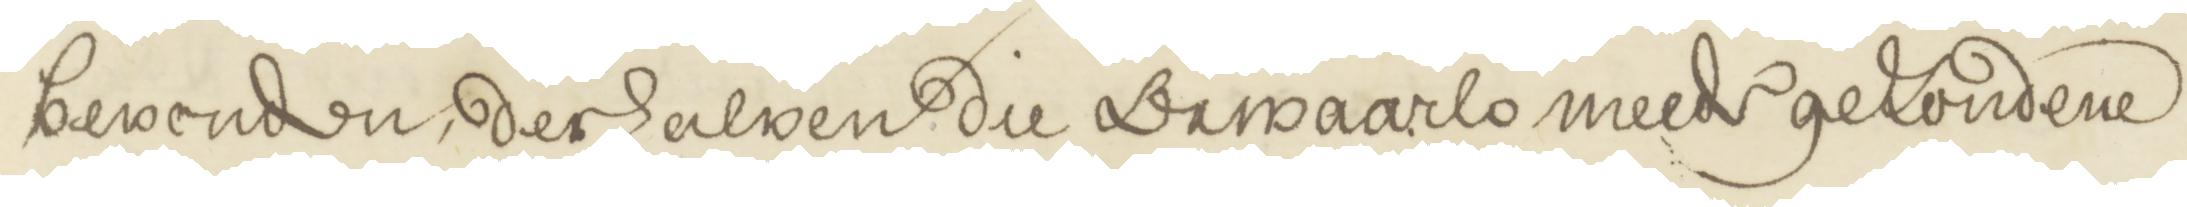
bevonden, derhalven die terwaarlo meede gezondene
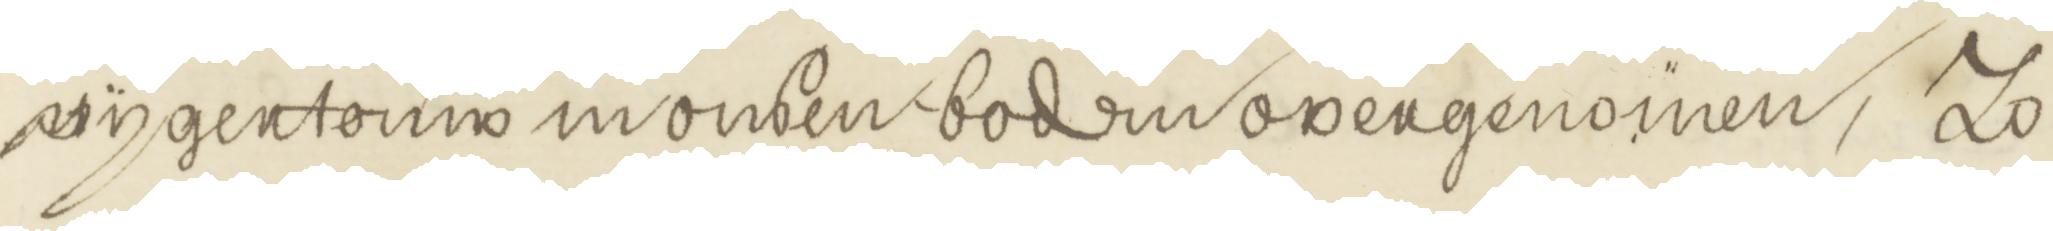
wijgertouw in onsen bodem overgenomen, zo
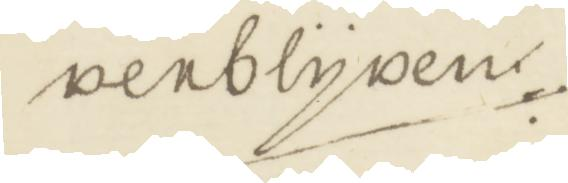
verblijven
